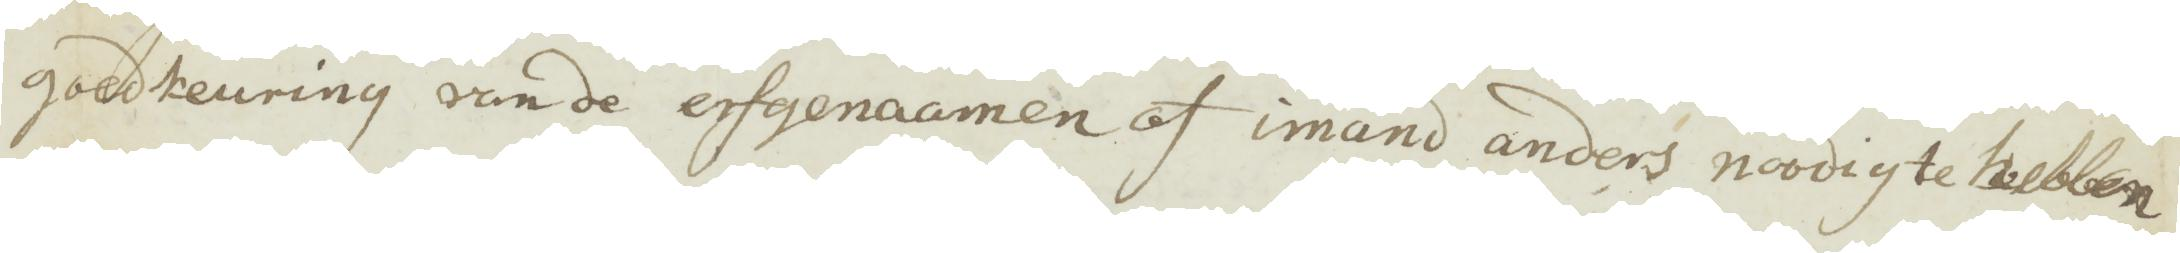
goedkeuring van de erfgenaamen of imand anders noodig te hebben
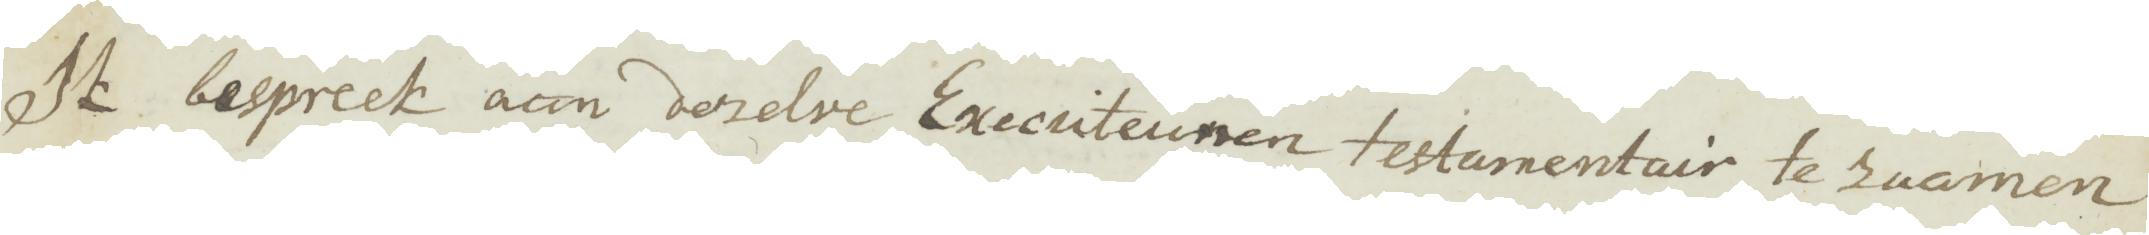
Ik bespreek aan dezelve Executeuren testamentair te zaamen
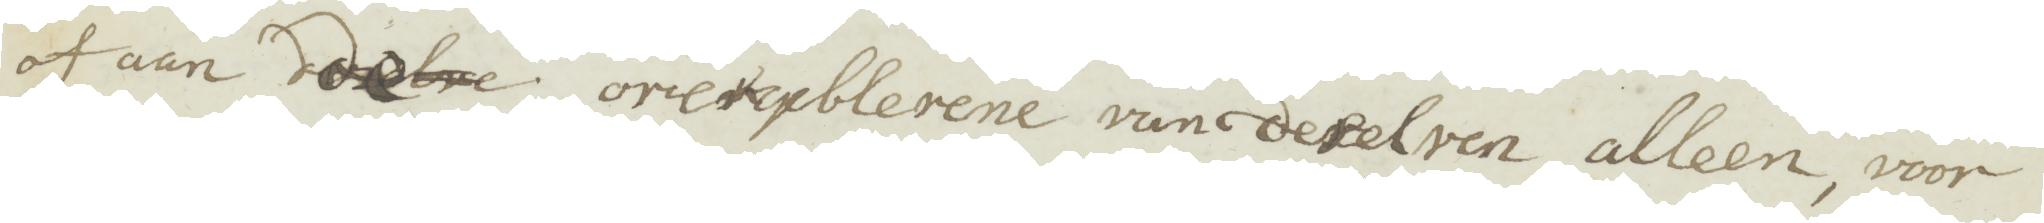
of aan ddelve overgeblevene van dezelven alleen, voor
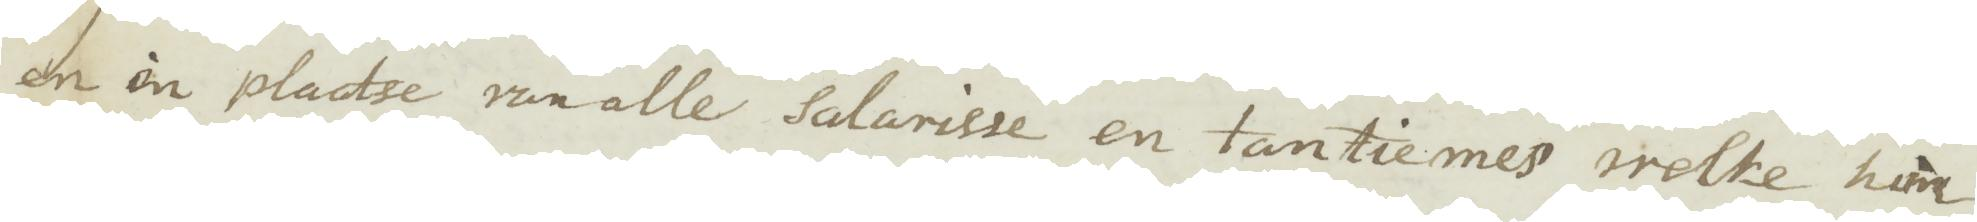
en in plaatse van alle salarisse en tantiemes welke hun
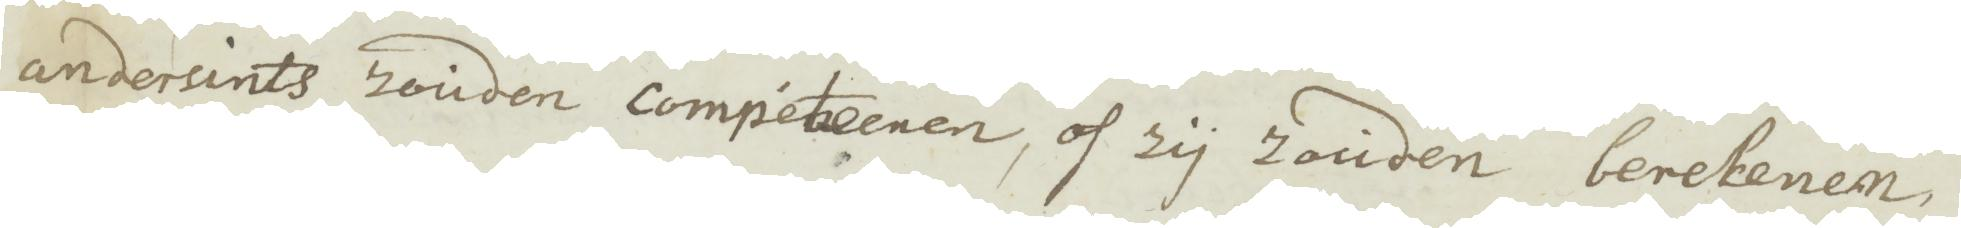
andersints zouden competeeren, of zij zouden berekenen,
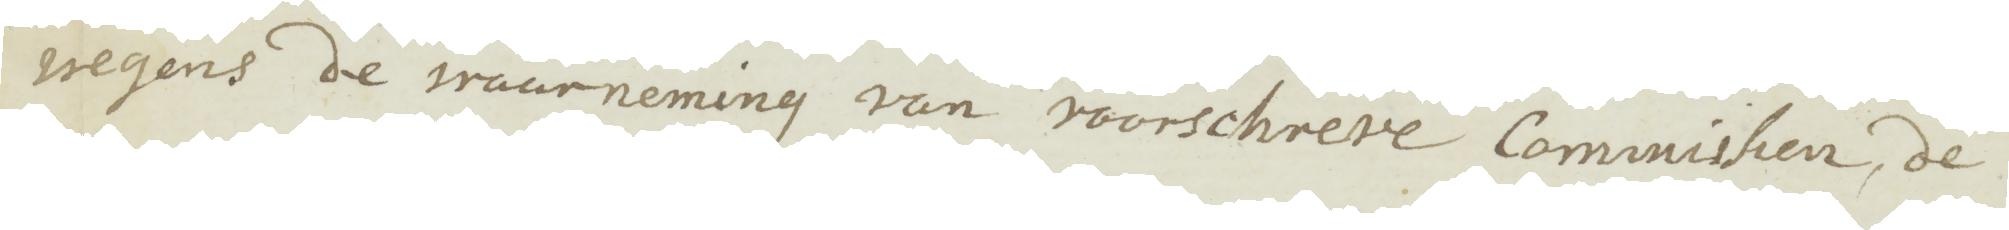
wegens de waarneming van voorschreve Commissien, de
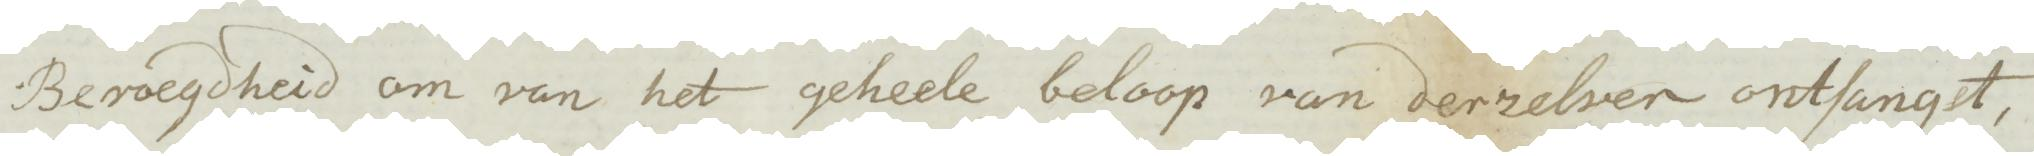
Bevoegdheid om van het geheele beloop van derzelver ontfangst,
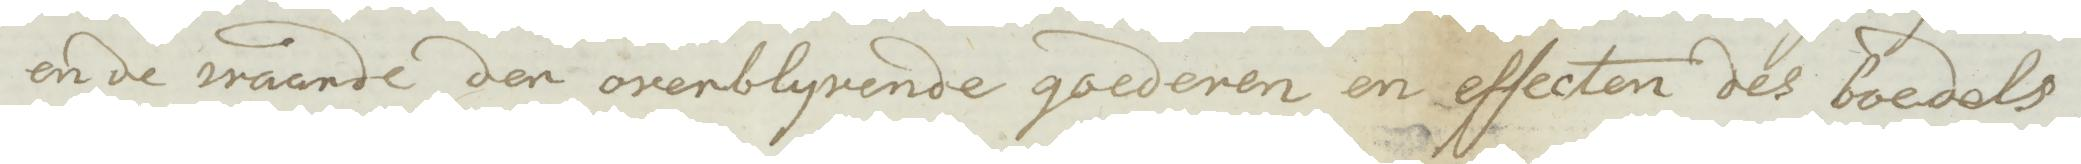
en de waarde der overblyvende goederen en effecten des boedels
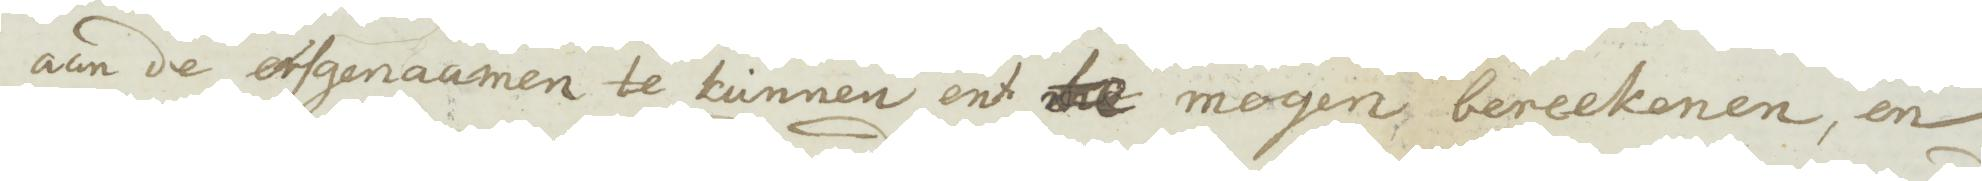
aan de erfgenaamen te kunnen ent te mogen bereekenen, en
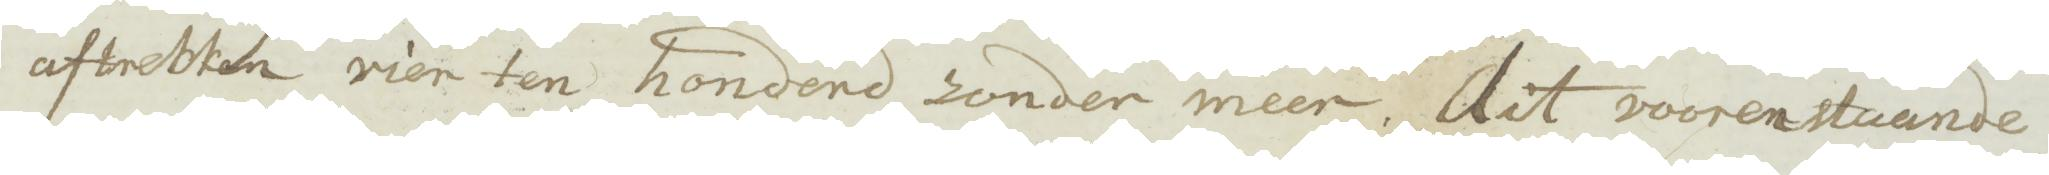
aftrekken vier ten honderd, zonder meer. Dit voorenstaande
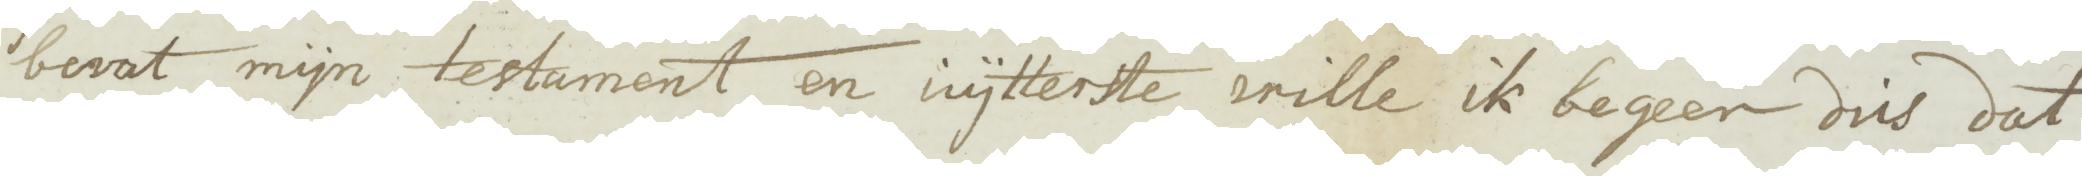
bevat mijn testament en uijtterste wille ik begeer dus dat
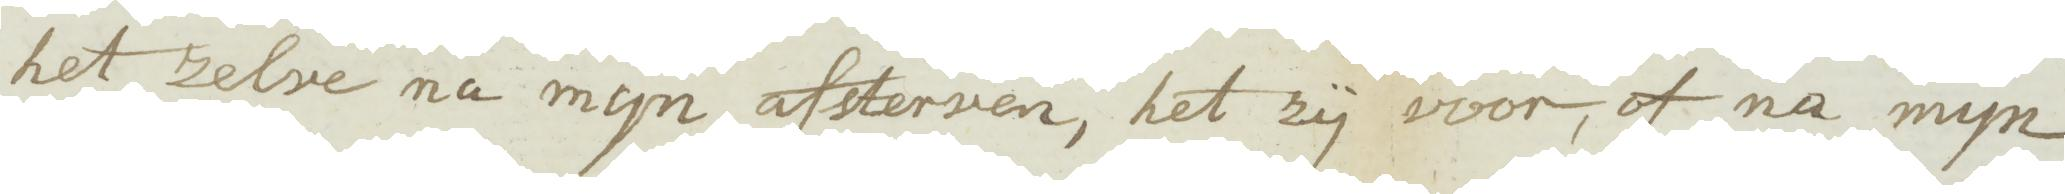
het zelve na mijn afsterven, het zij voor, of na myn
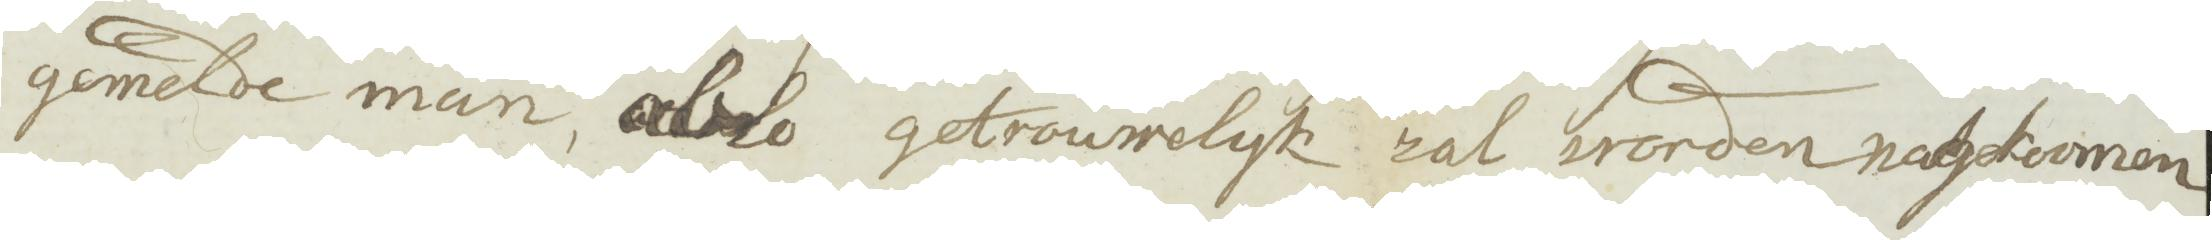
gemelde man, alzo getrouwelyk zal worden nagekoomen
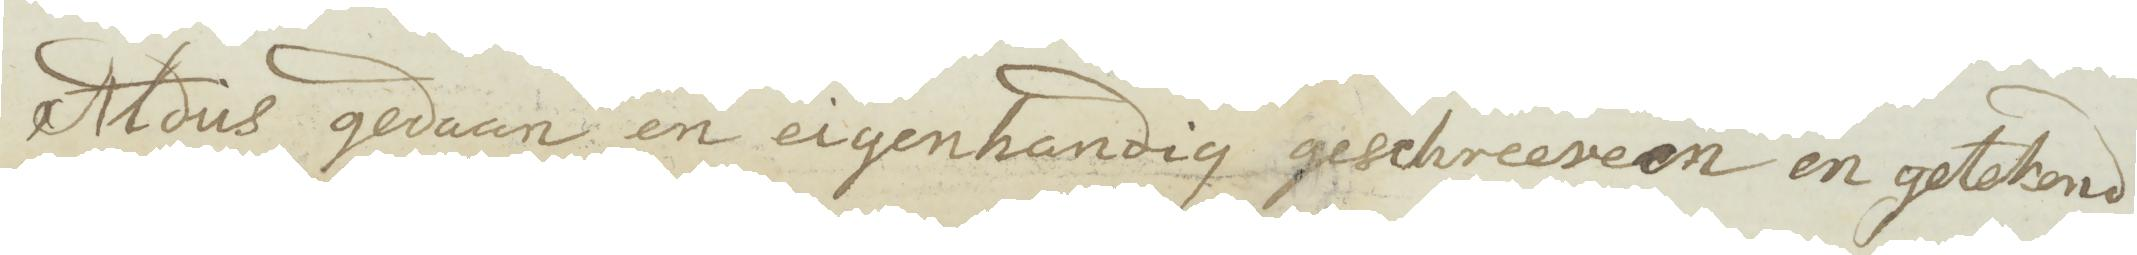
Aldus gedaan en eigenhandig geschreeveen en getekend
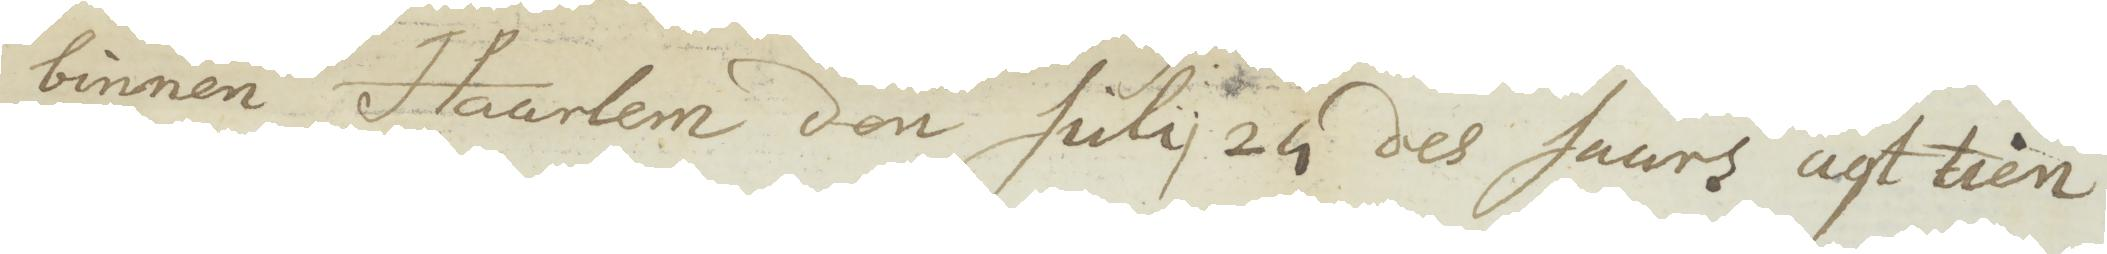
binnen Haarlem den Julij 24 des Jaars agt tien
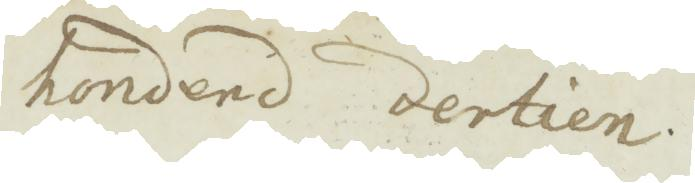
honderd dertien.
